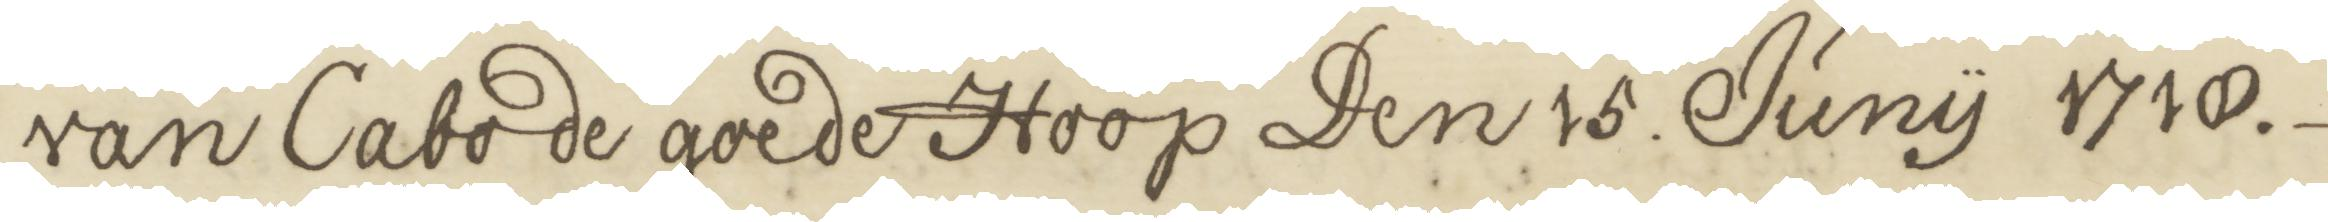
van Cabo de goede Hoop Den 15. Junij 1718.
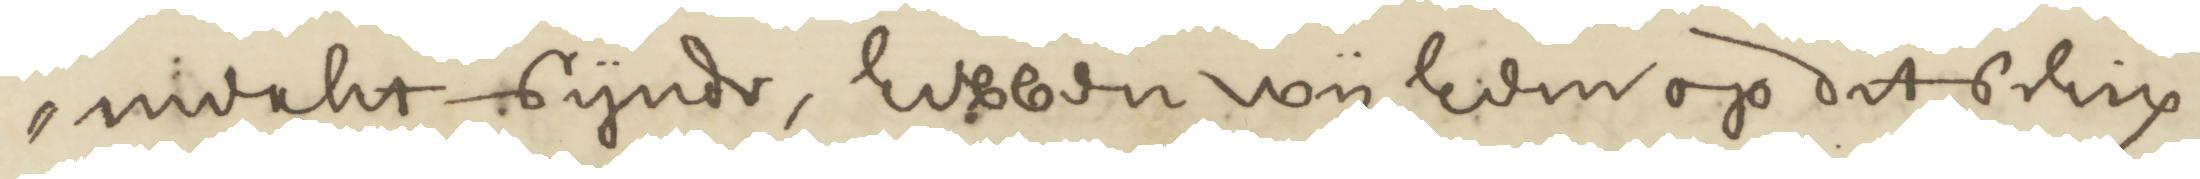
„merkt sijnde, hebben wij hem op dit schip
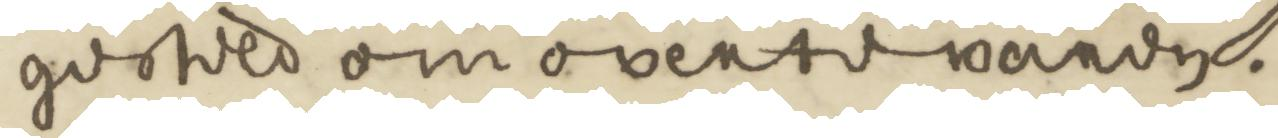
gesteld om overte varen.
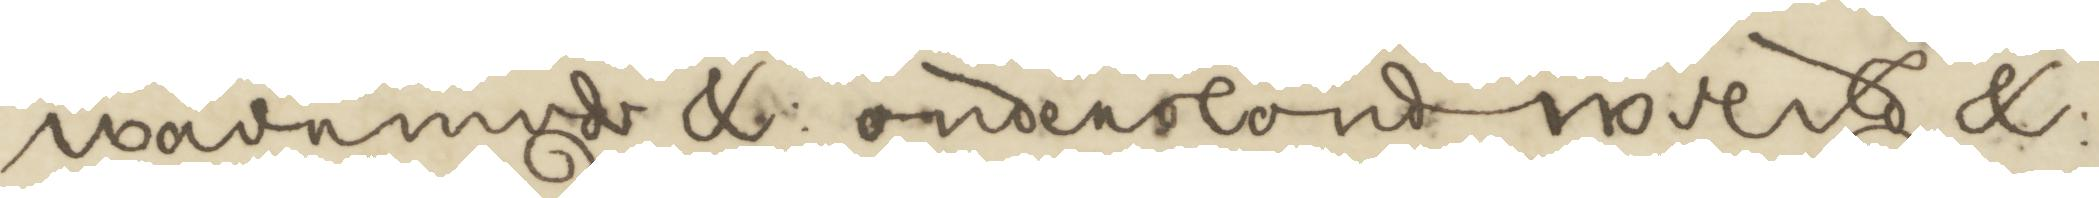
waer mede &: onderstond wel Ed &:
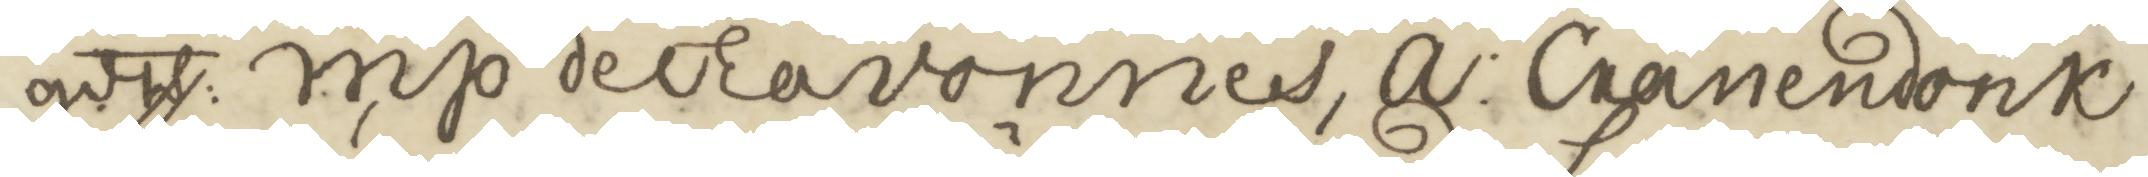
getg: mp de chavonnes, A: Cranendonk
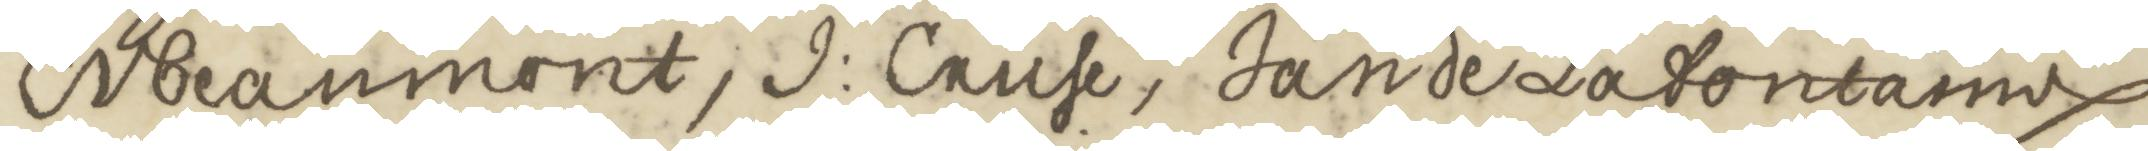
CVbeaumont, J: Cruse, Jan de Lafontaine
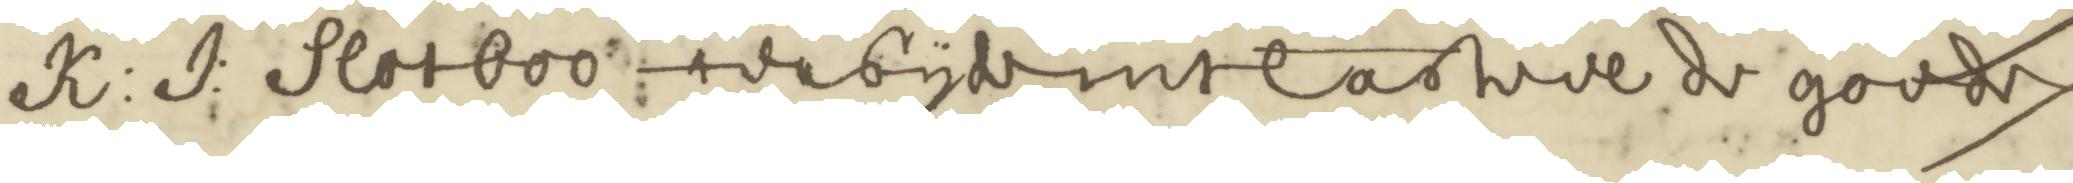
K: J: Slotboo tersijde int Casteel de goede
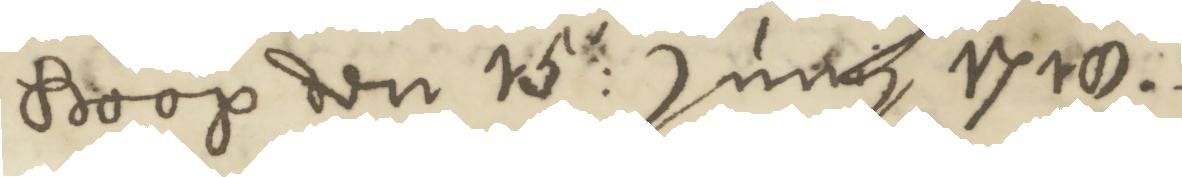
Hoop den 15:' Junij 1718.
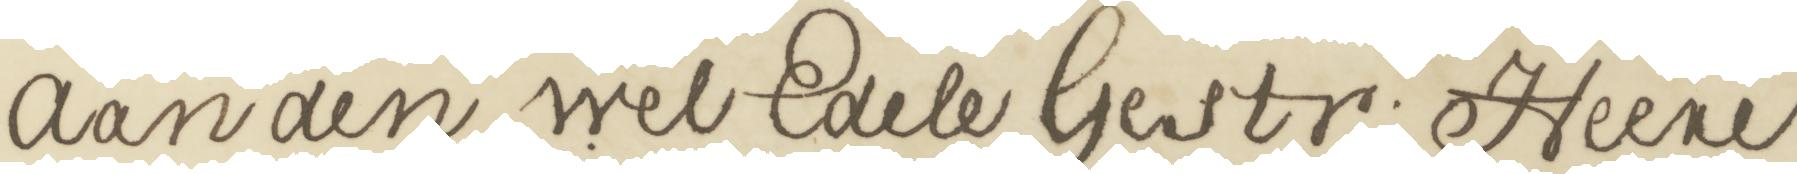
Aan den wel Edele Gestr: Heere
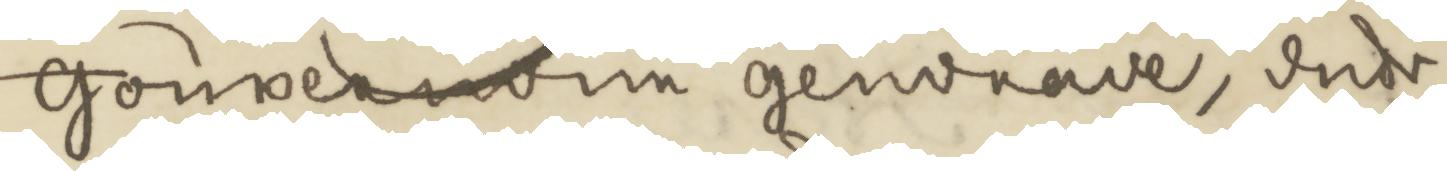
gouverneur generael, ende
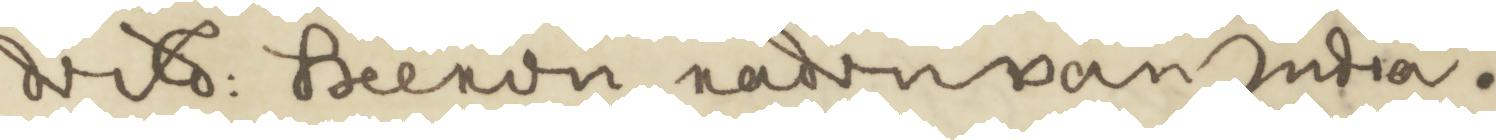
de Ed: Heeren raden van Jndia.
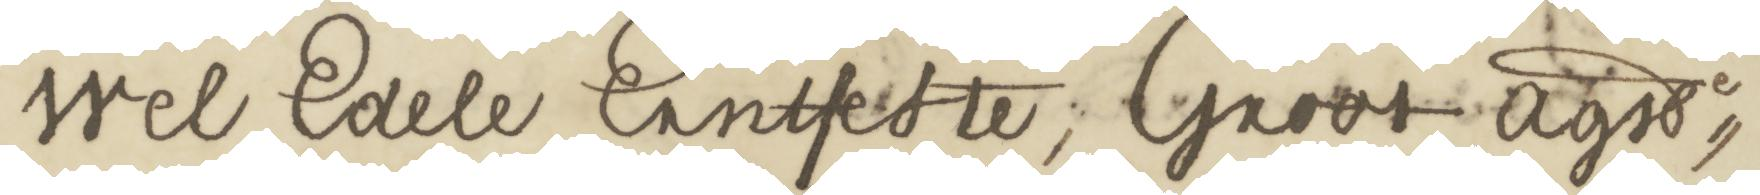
Wel Edele Erntfeste; Groot agtb„e
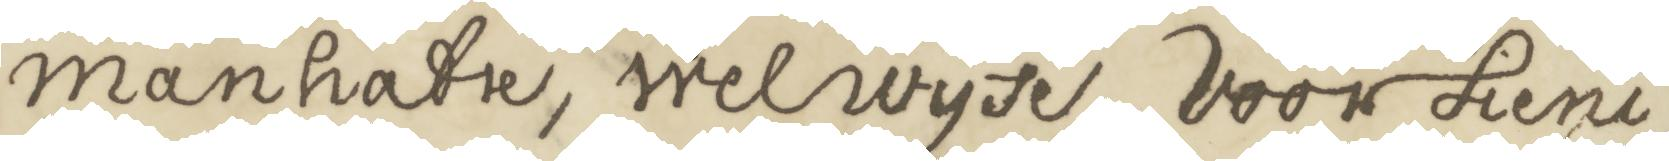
manhare, welwijse, voor sieni
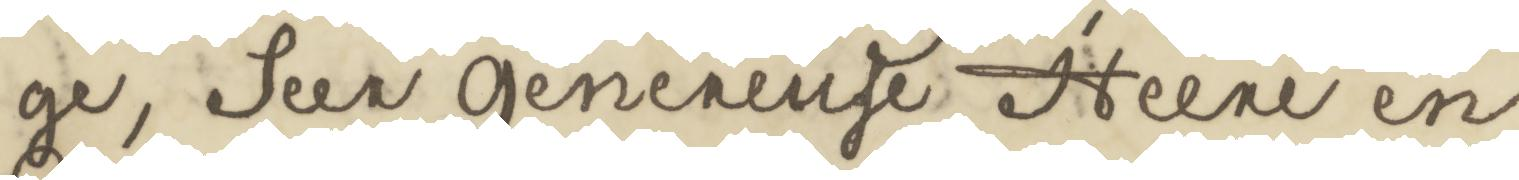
ge, seer genereuse Heere en
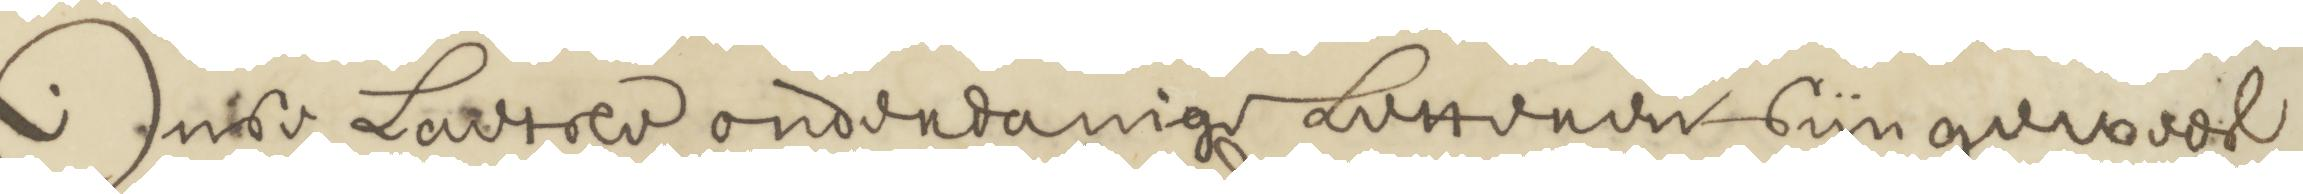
Inde Laetste onderdanige Letteren sijn geweest
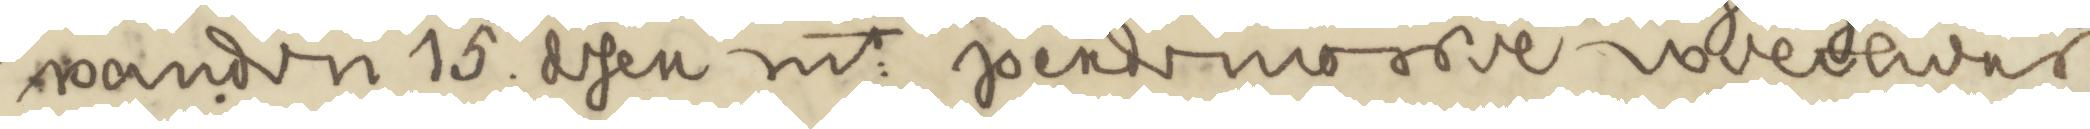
vanden 15. desen m:t perde missive welckers
